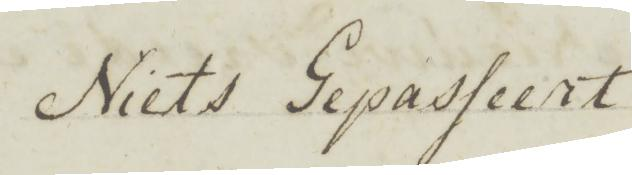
Niets Gepasseert
